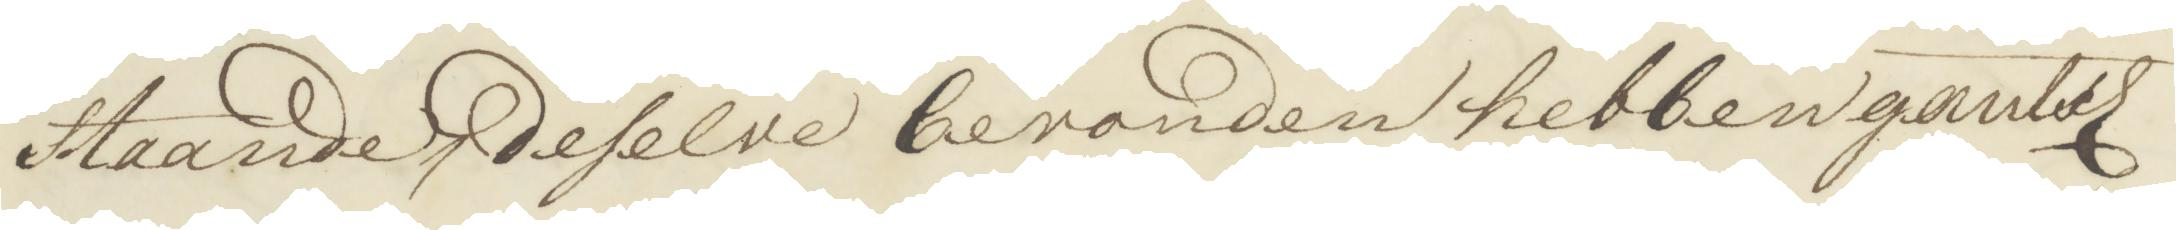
staande, deselve bevonden hebben gantsch
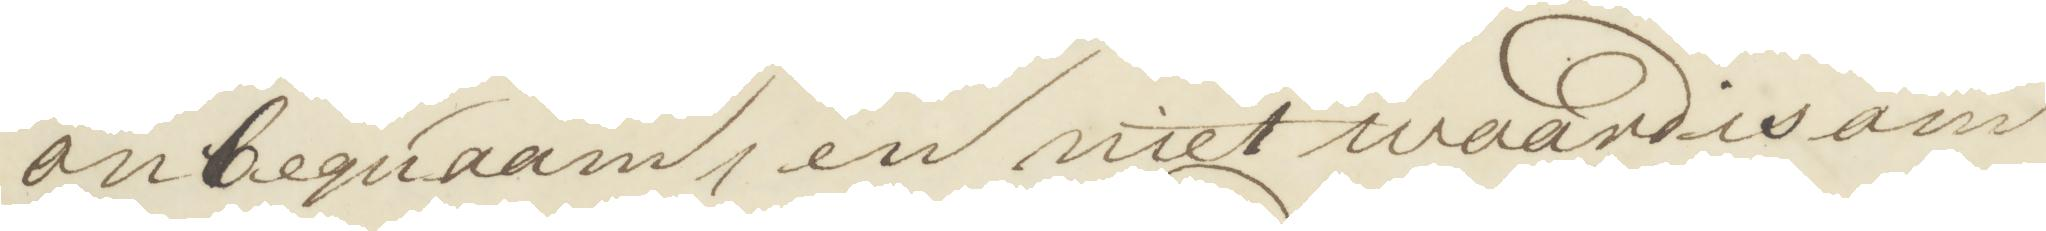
onbequaam, en niet waard is om
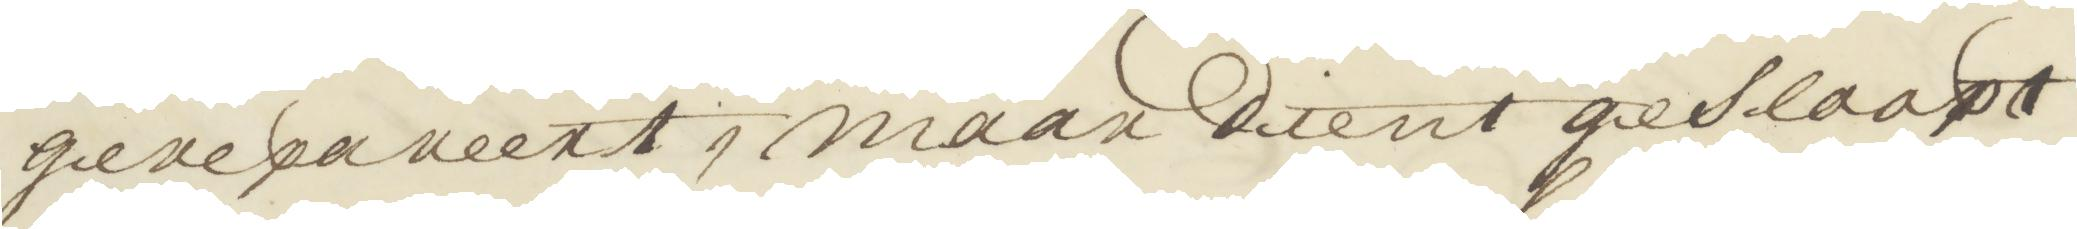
gerepareert, maar dient gesloopt
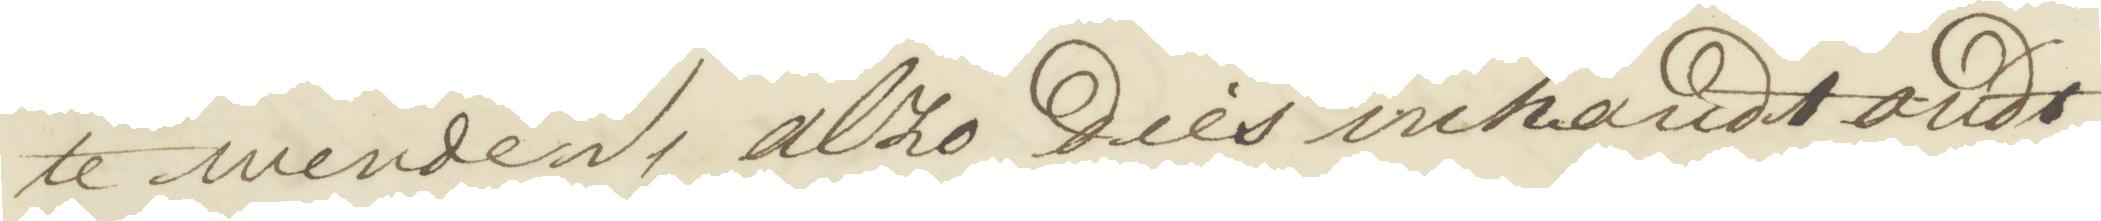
te werden, alzo dies inhoudt oudt
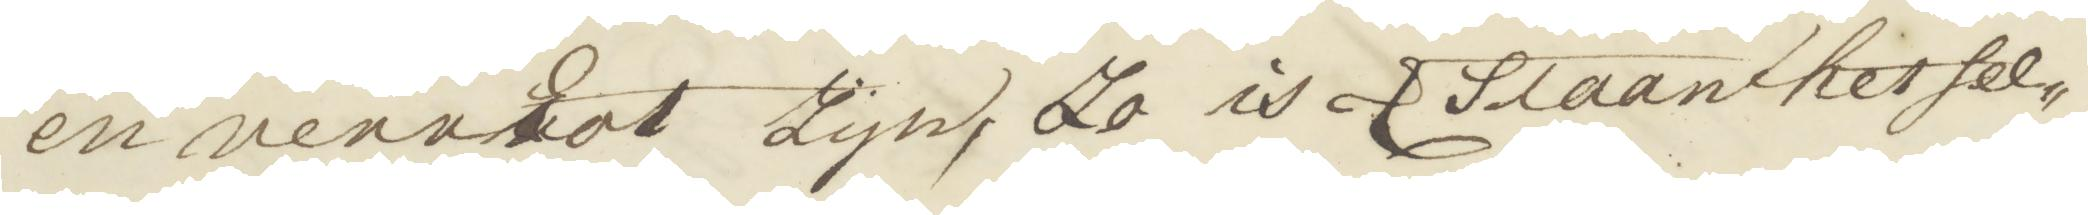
en verrhot zijn, zo is verstaan het sel„
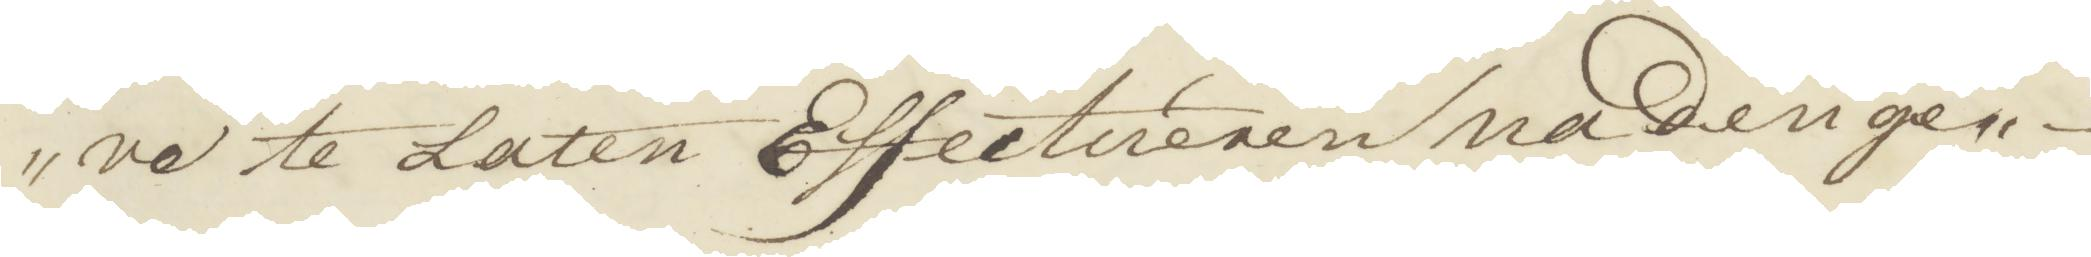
„ve te laten Effectueren na den ge„-
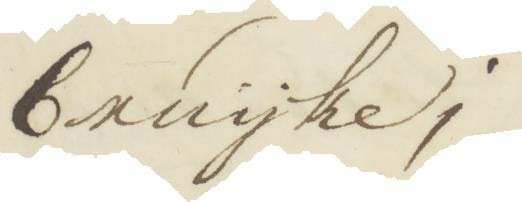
bruijke;
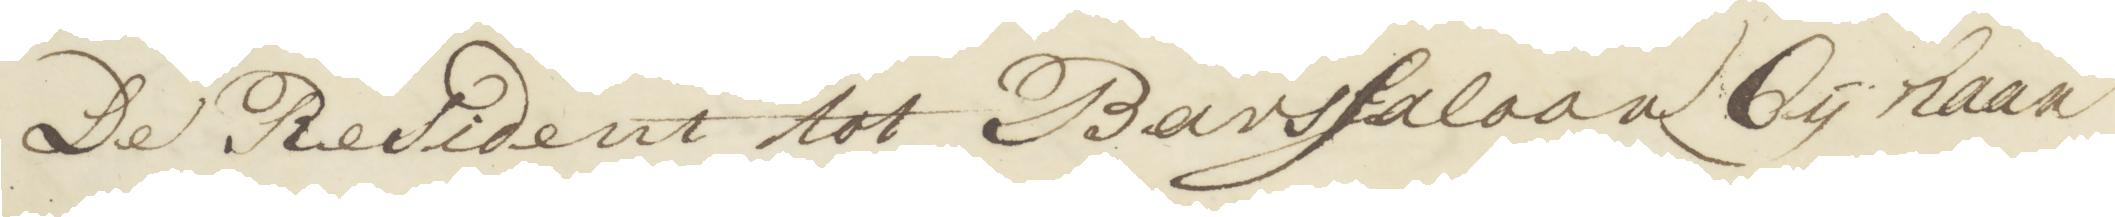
De Resident tot Barssaloar bij haar
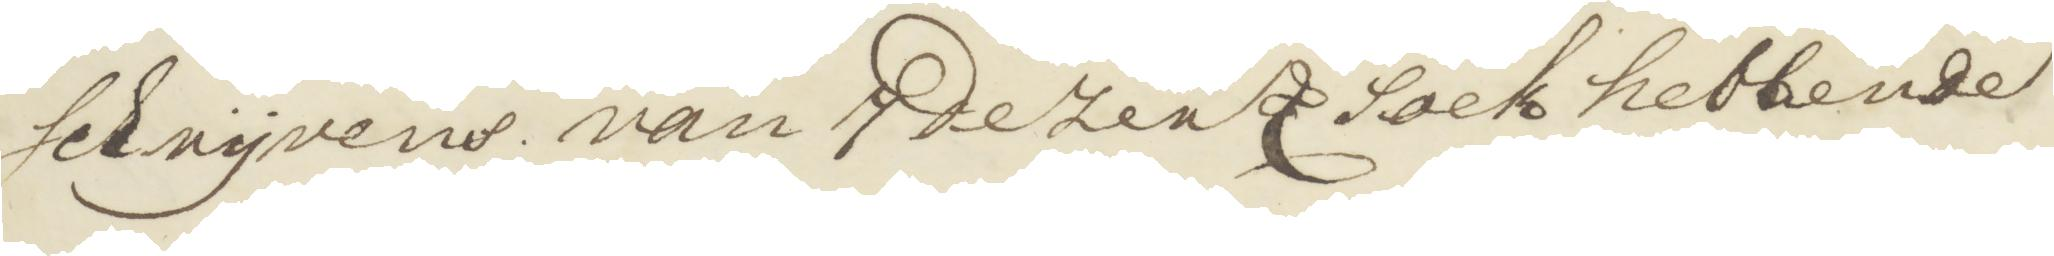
schrijvens van 7 dezer versoek hebbende
